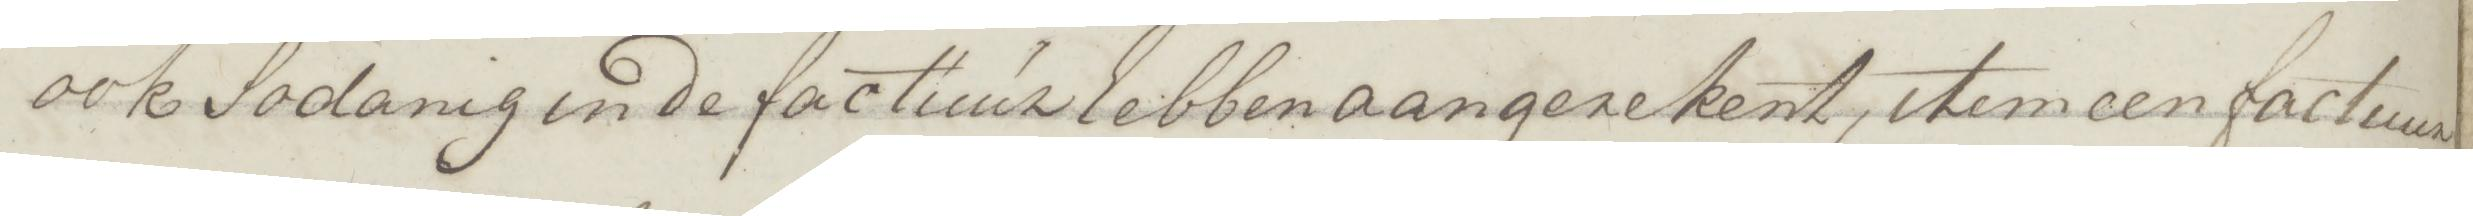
ook sodanig in de factuur hebben aangerekent, item een factuur
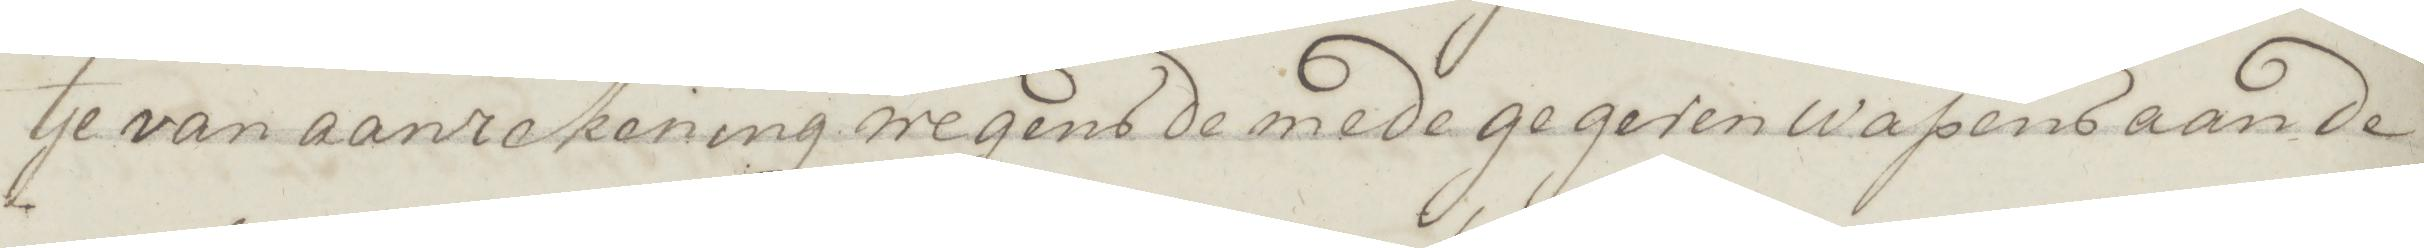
tje van aanrekening wegens de mede gegeven wapens aan de
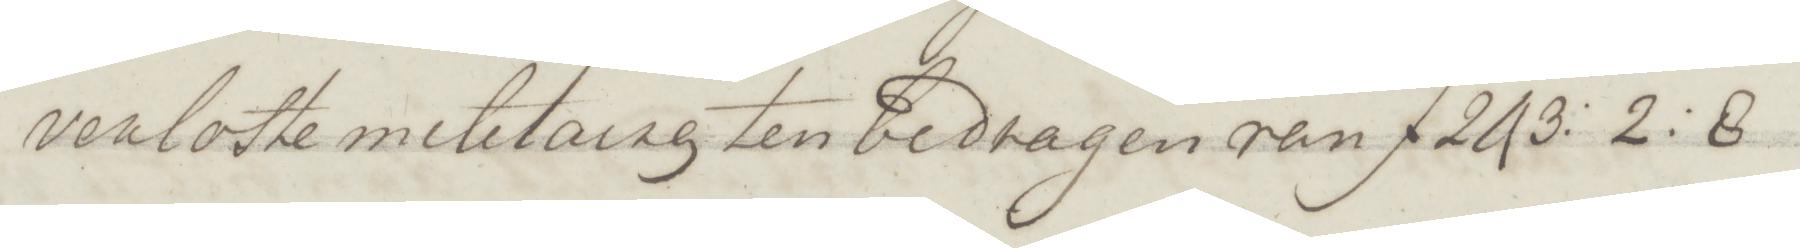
verloste militairen ten bedragen van ƒ243: 2: 8
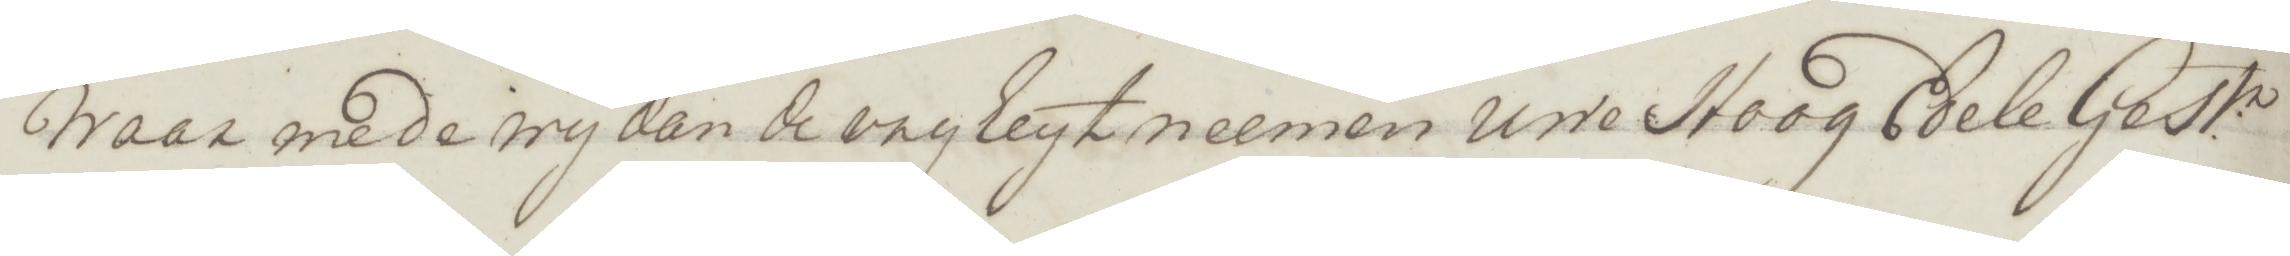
waar mede wy dan de vryheyt neemen uwe Hoog Edele Gest:r
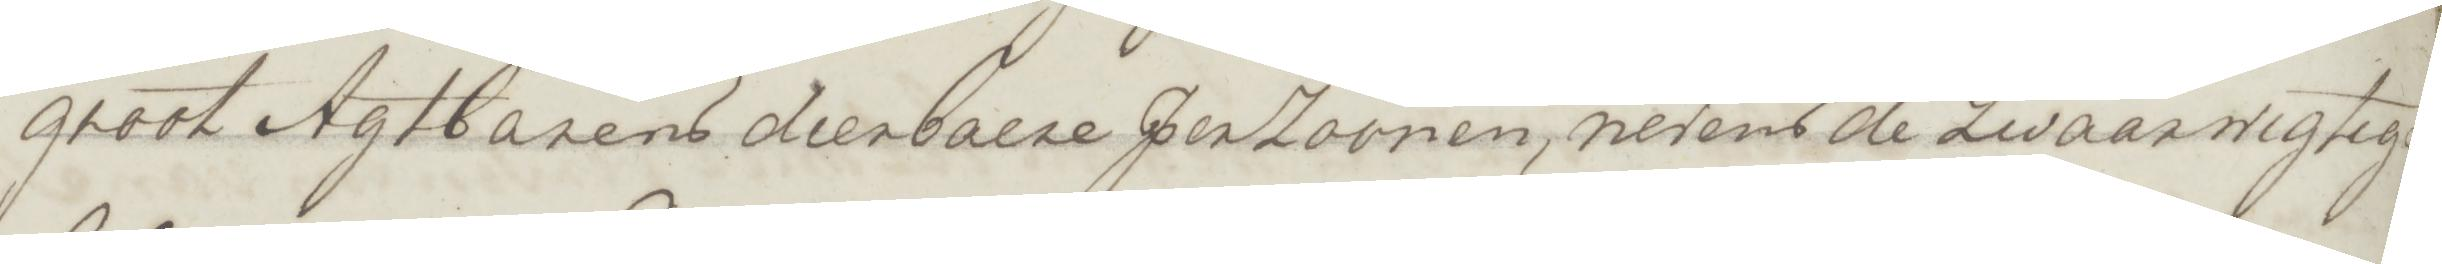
groot Agtbarens dierbaere perzoonen, nevens de Zwaarwigtige
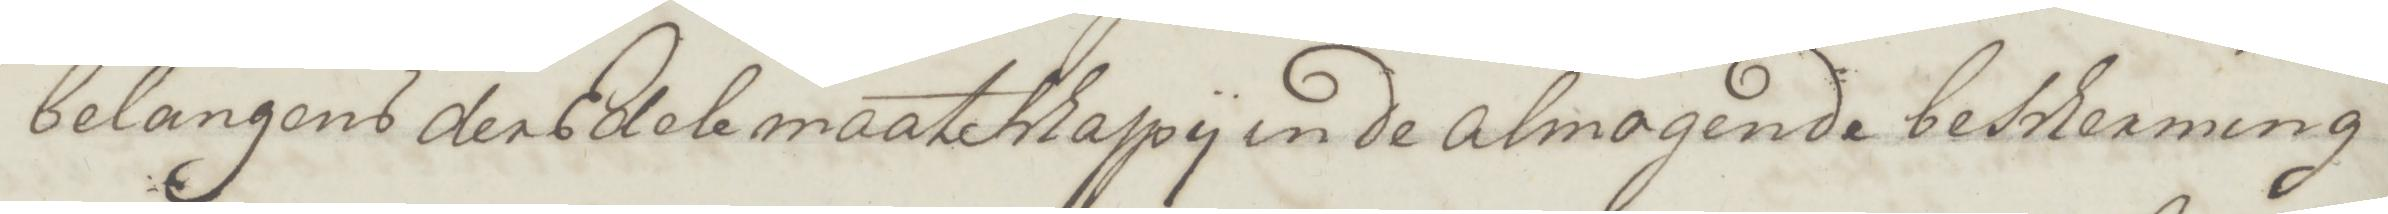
belangens der Edele maatschappij in de almogende bescherming
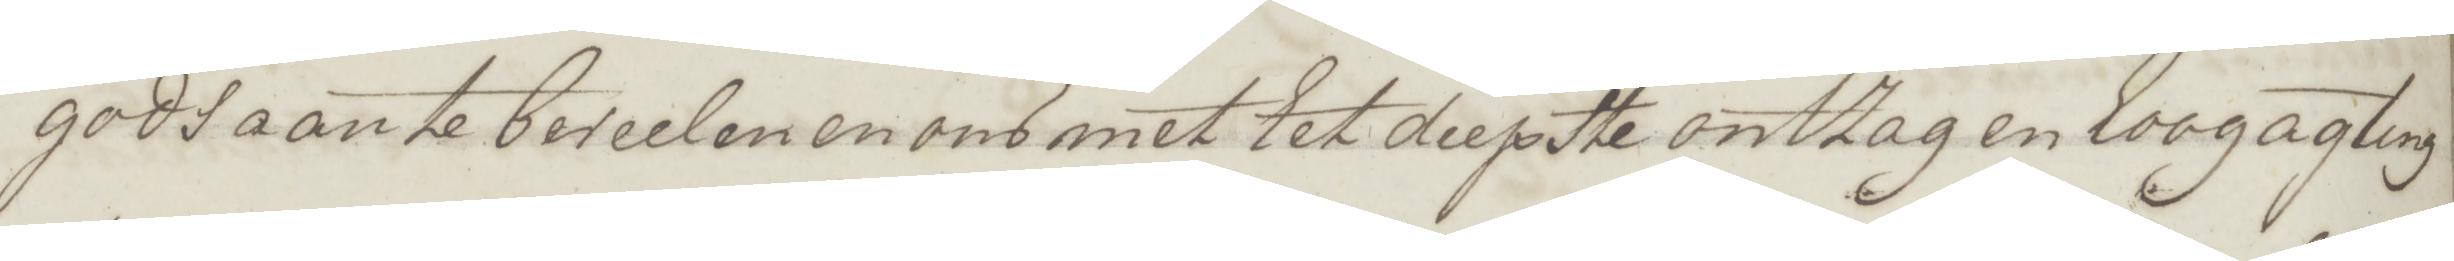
gods aan te beveelen en ons met het diepste ontzag en hoogagting
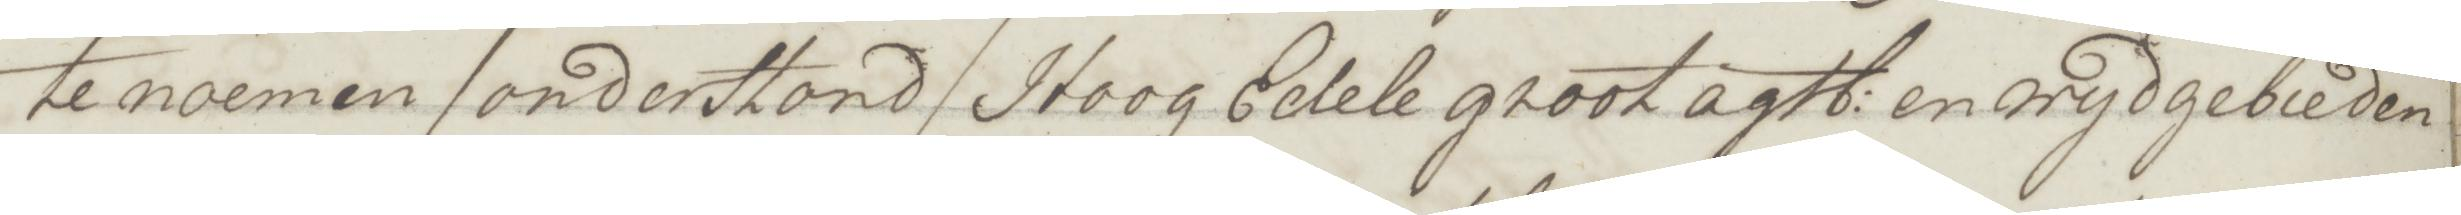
te noemen /onderstond/ Hoog Edele groot agtb: en wydgebieden
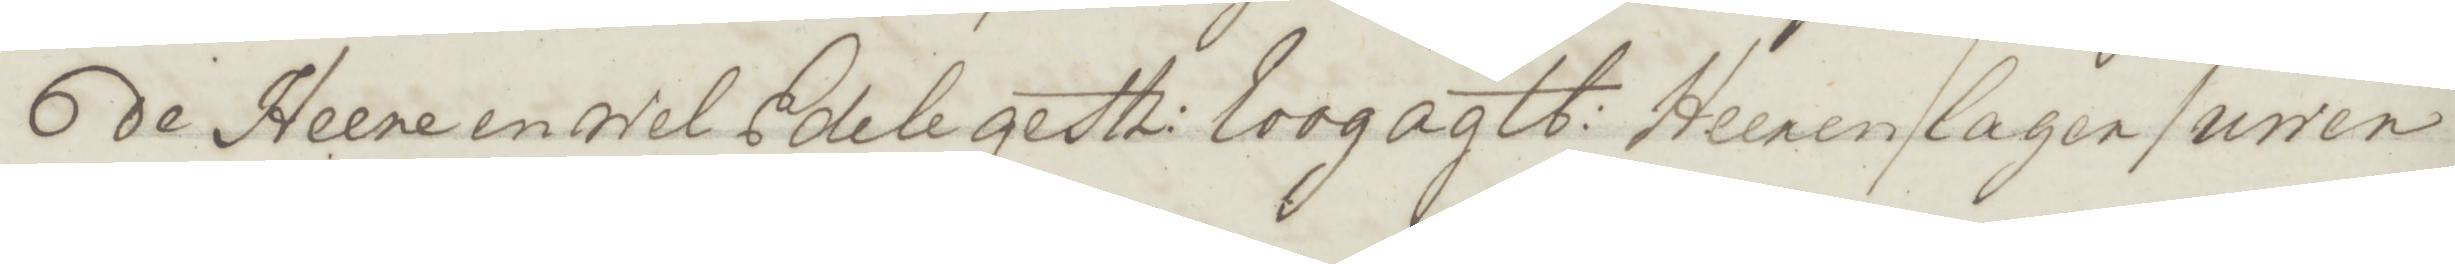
de Heere en wel Edele gestr: hoog agtb: Heeren /lager/uwer
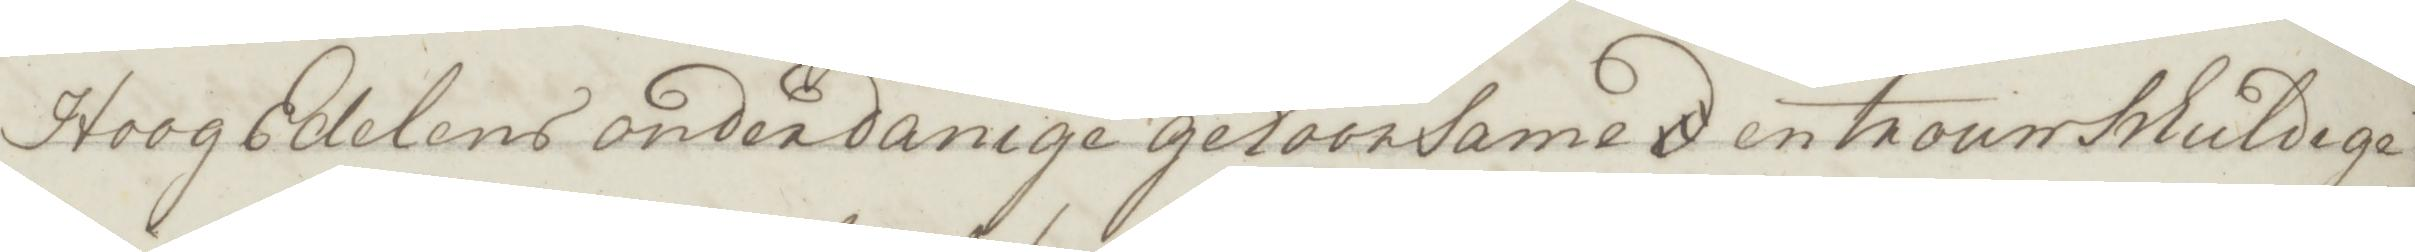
Hoog Edelens onderdanige gehoorsame d en trouwschuldige
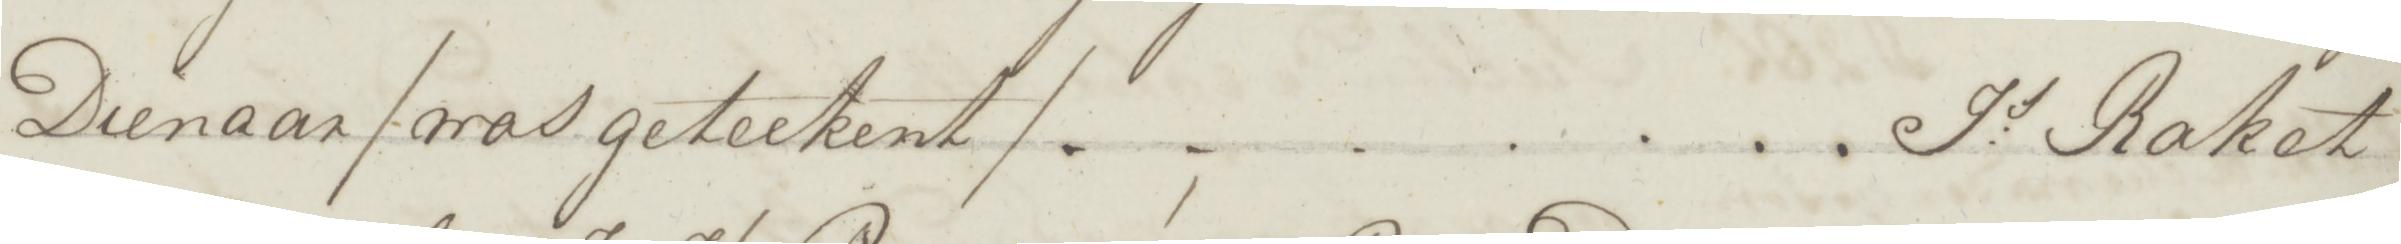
Dienaar /:was geteekent/ . . . . . . . J:s Raket
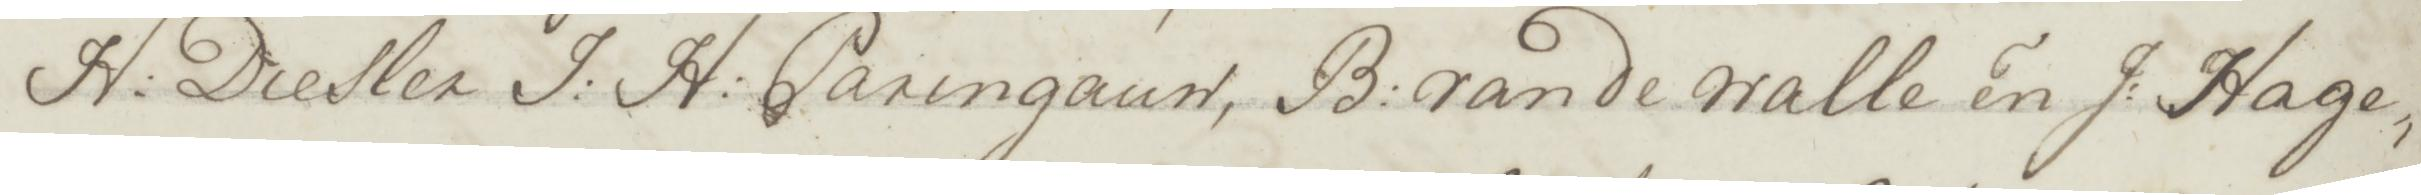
H: Diesler J: H: Paringauw, B: van de walle En J: Hage„
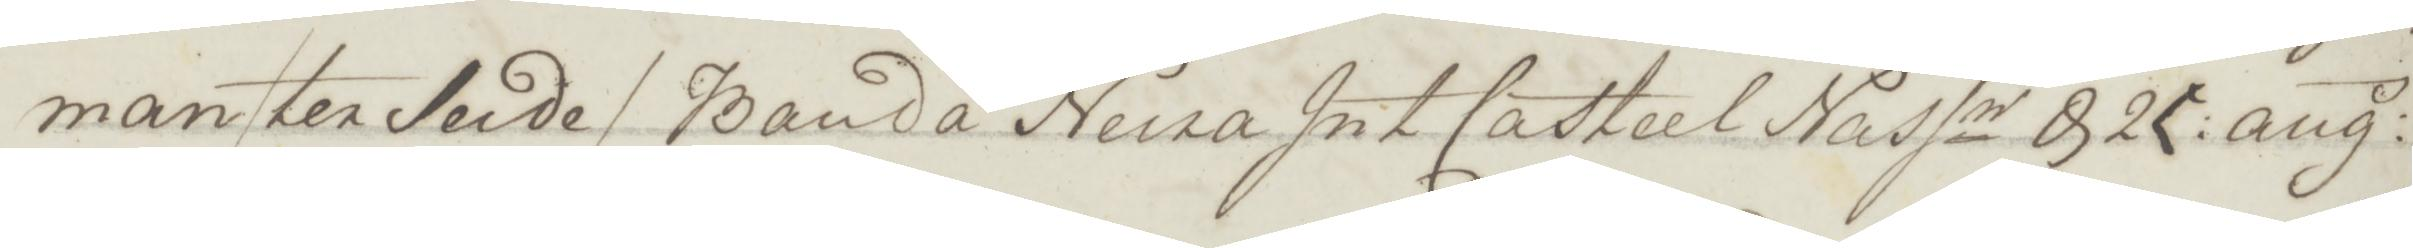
man /ter seide/ Banda Neira Jnt Casteel Nass_w de 25: aug:s
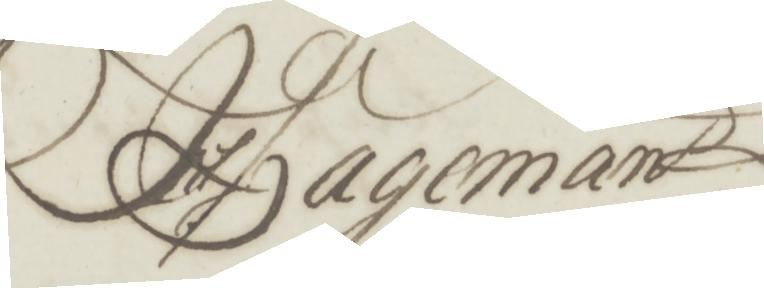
J: Hageman
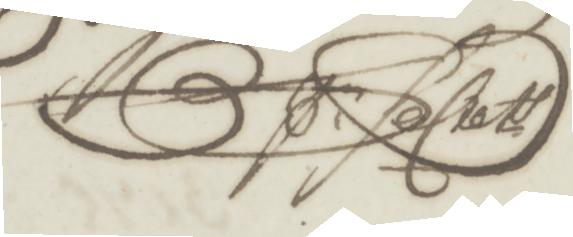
B p: Secrets
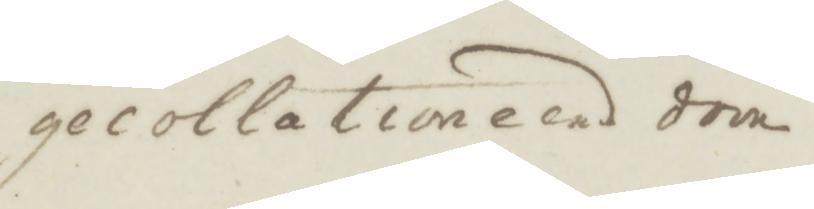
gecollationeerd door
